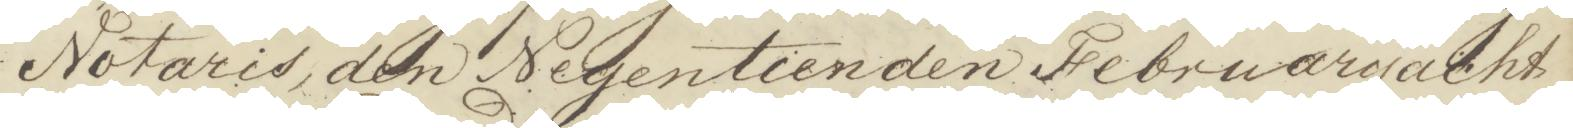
Notaris, den Negentienden February acht
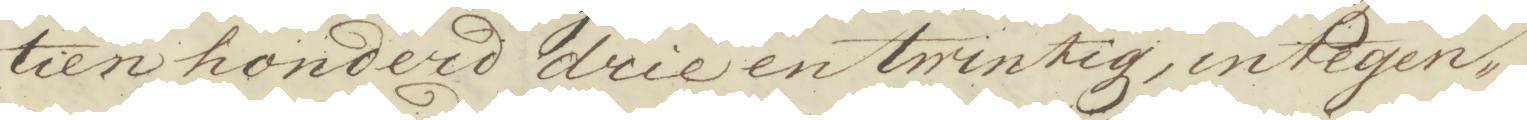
tien honderd drie en twintig, integen„
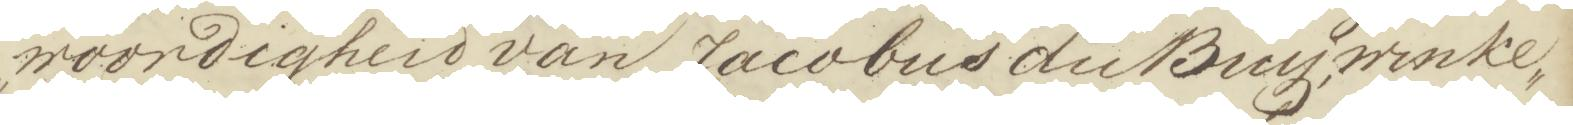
woordigheid van Jacobus du Buij winke„
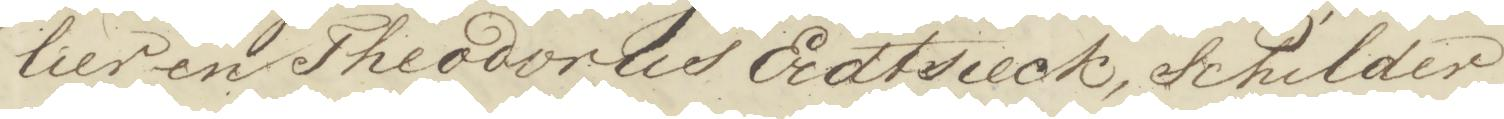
lier en Theodorus Erdtsieck, schilder
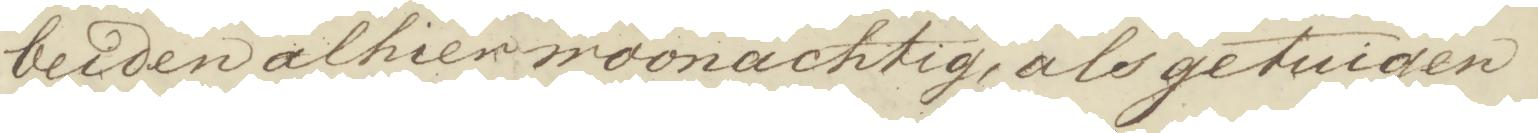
beiden alhier woonachtig, als getuigen
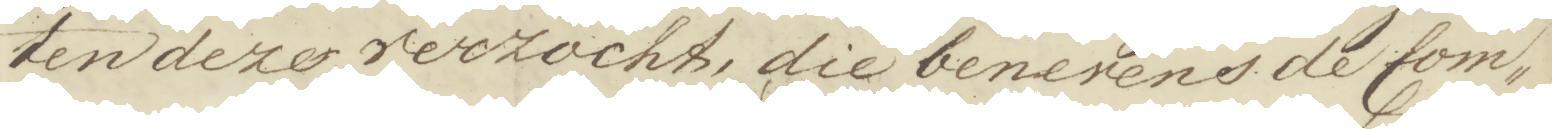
ten deze verzocht, die benevens de Com„
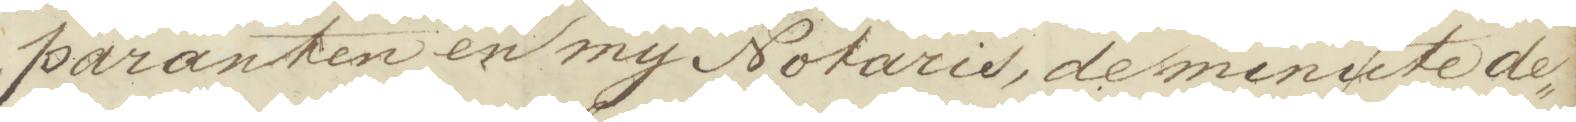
paranten en my Notaris, de minute de„
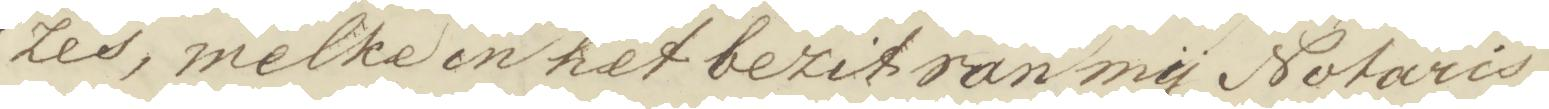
zes, welke in het bezit van mij Notaris
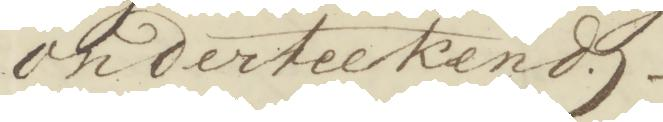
onderteekend. -
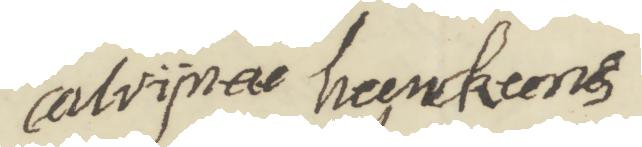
calvijnae heerkeens
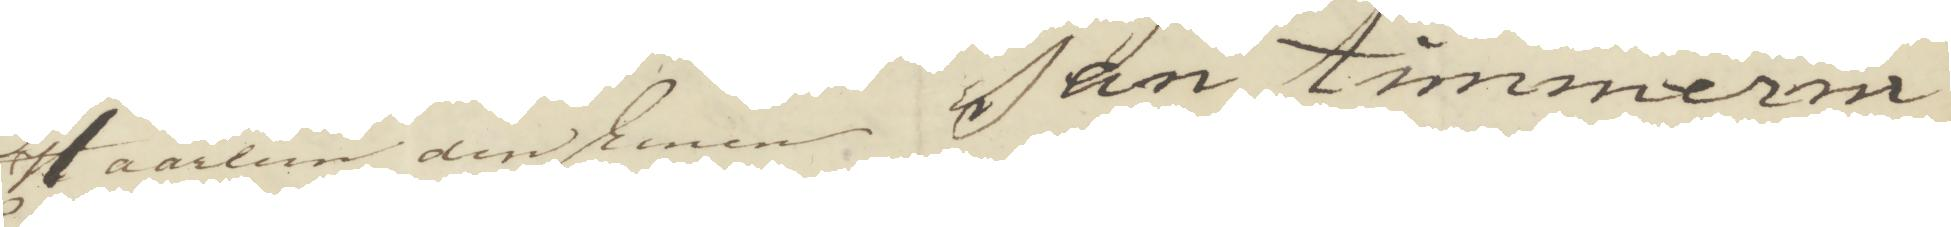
Haarlem den Eenen Jan Timmerm
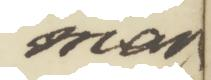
man
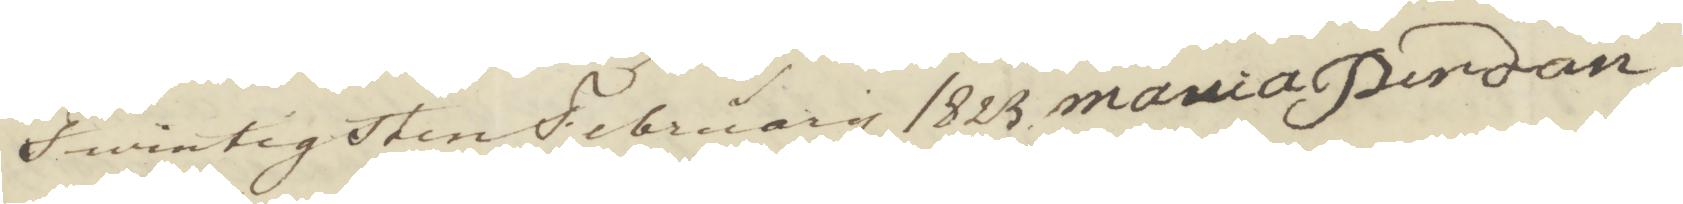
Twintigsten Februarij 1823, maria Perdan
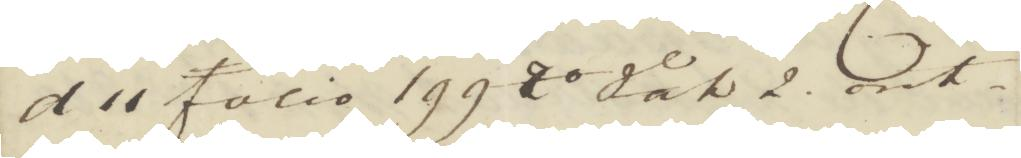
d 11 folio 199 ro Vak 2. ont _
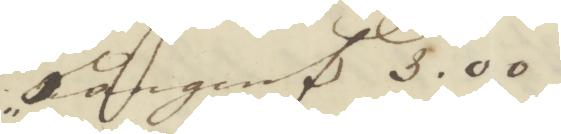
„vangen ƒ 3.00
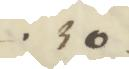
—. 30
